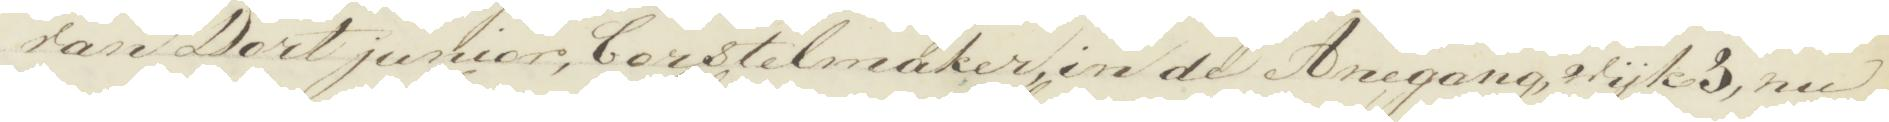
van Dort junior, borstelmaker, in de Anegang wijk 3, nu
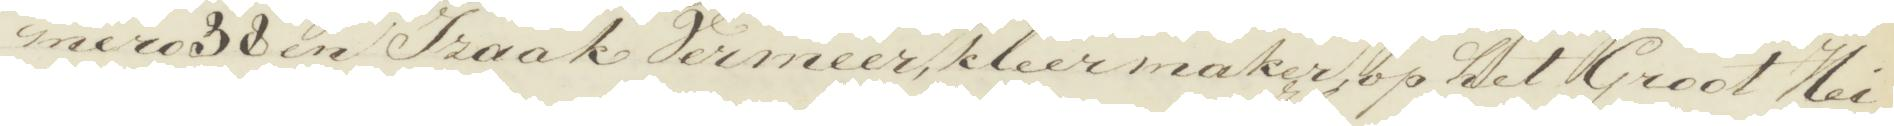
mero 38 en Izaak Vermeer, kleermaker, op het Groot Hei
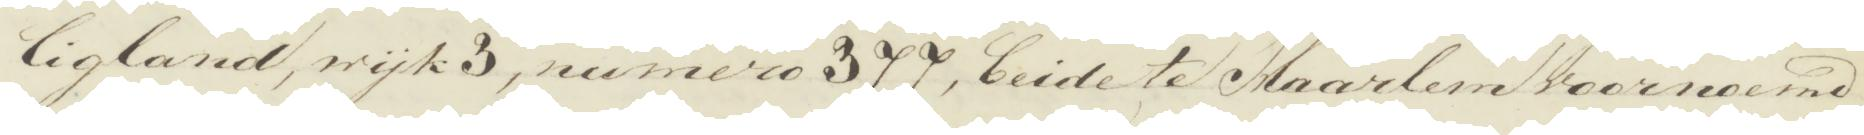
ligland, wijk 3, numero 377, beide te Haarlem voornoemd
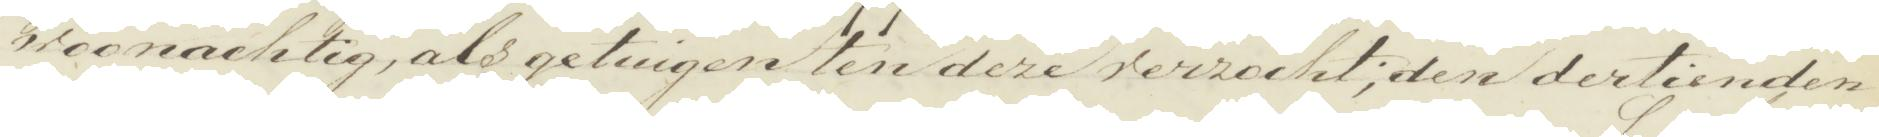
woonachtig, als getuigen ten deze verzocht, den dertienden
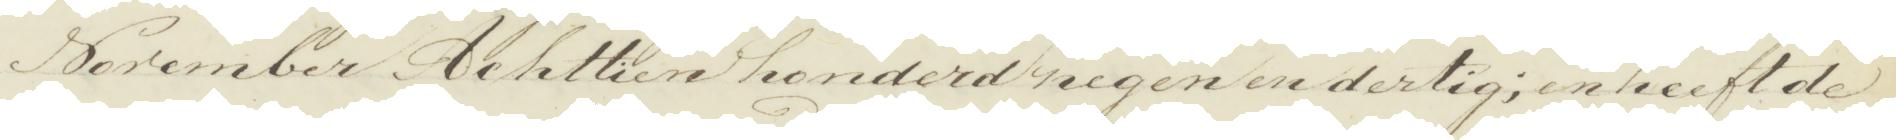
November Achttien honderd negen en dertig, en heeft de
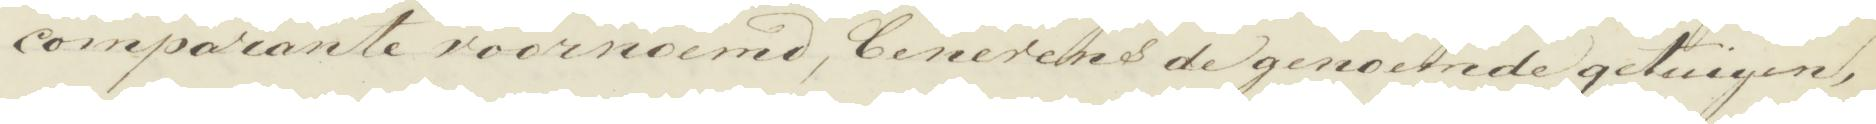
comparante voornoemd, benevens de genoemde getuigen,
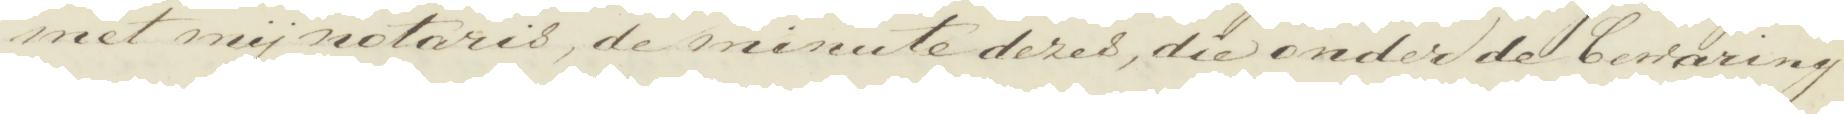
met mij notaris, de minute dezes, die onder de bewaring
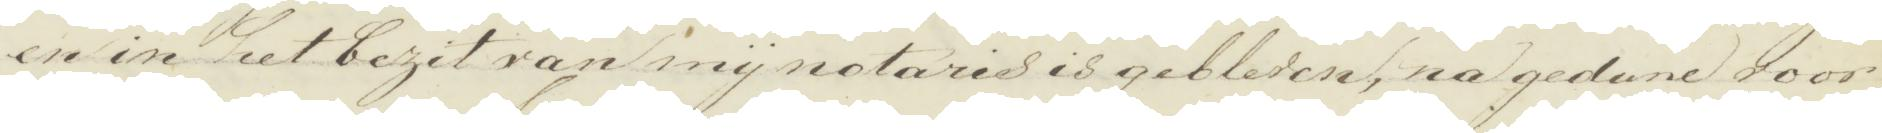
en in het bezit van mij notaris is gebleven, na gedane voor
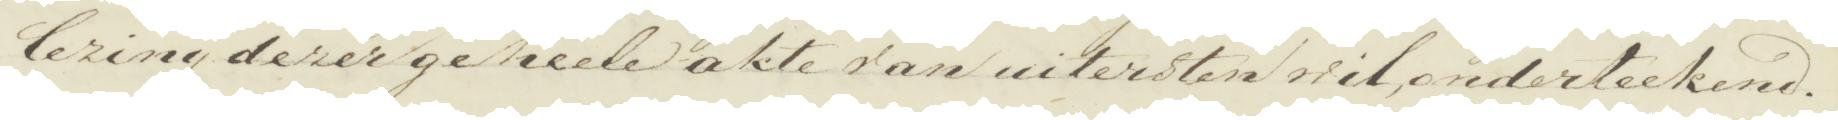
lezing dezer geheele akte van uitersten wil, onderteekend.
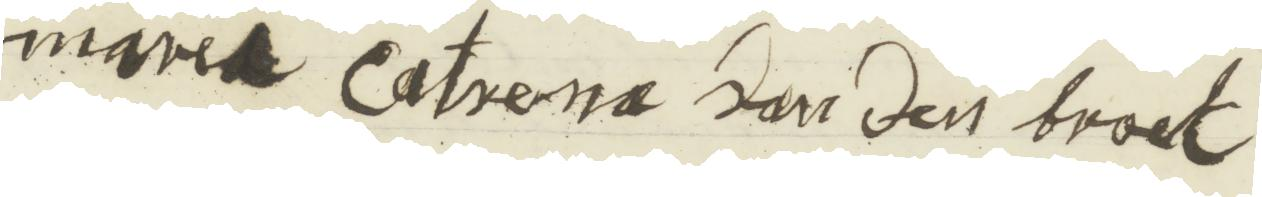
maria Catrena van den broek
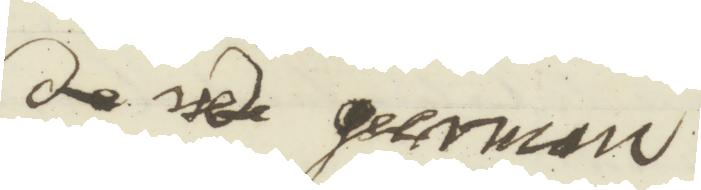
de vd geerman
